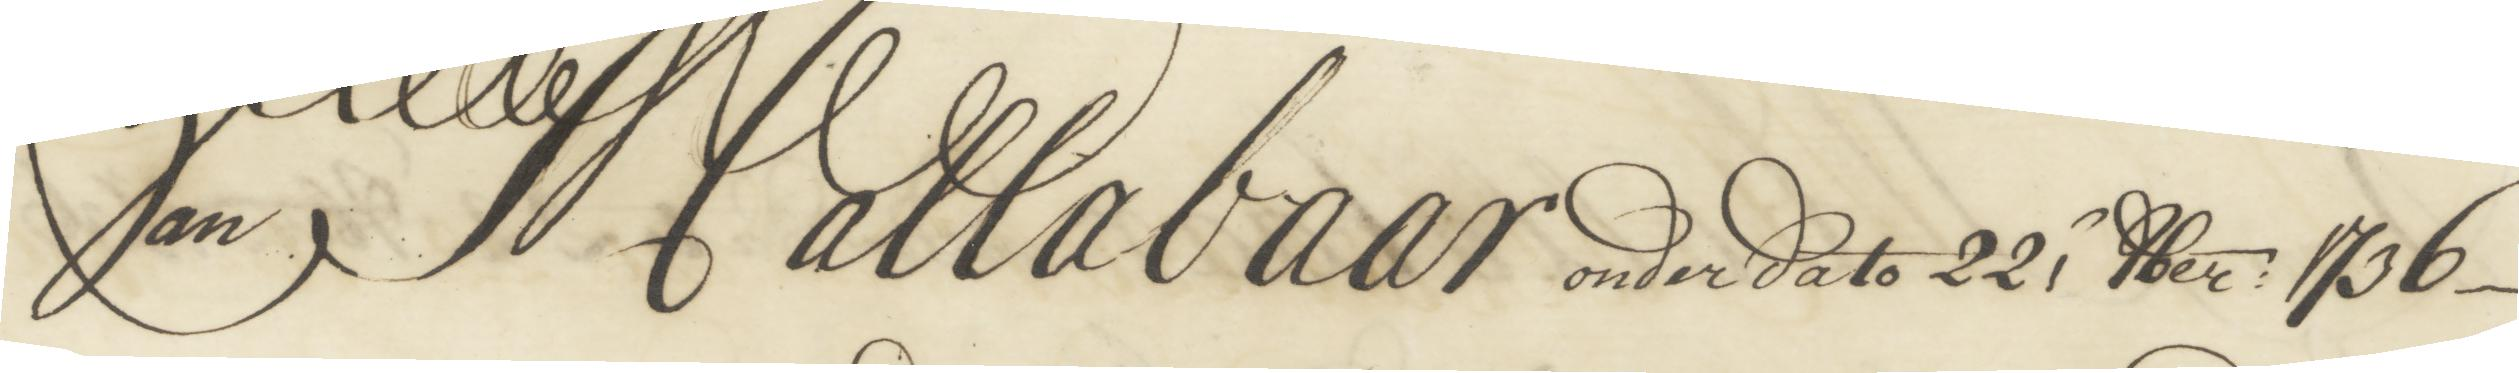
Van Mallabaar onder dato 22:' 8ber: 1736—
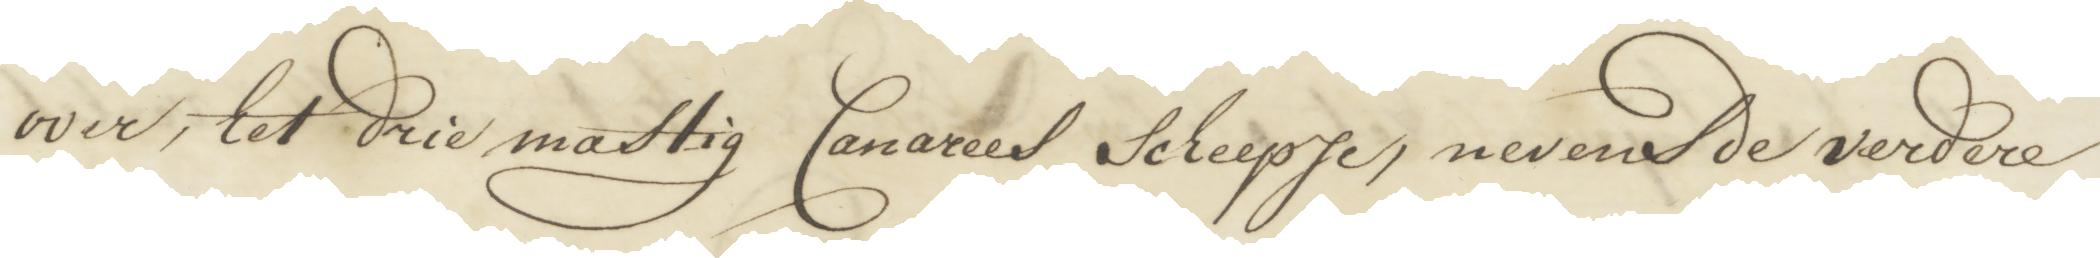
over, het drie mastig Canarees scheepje, nevens de verdere
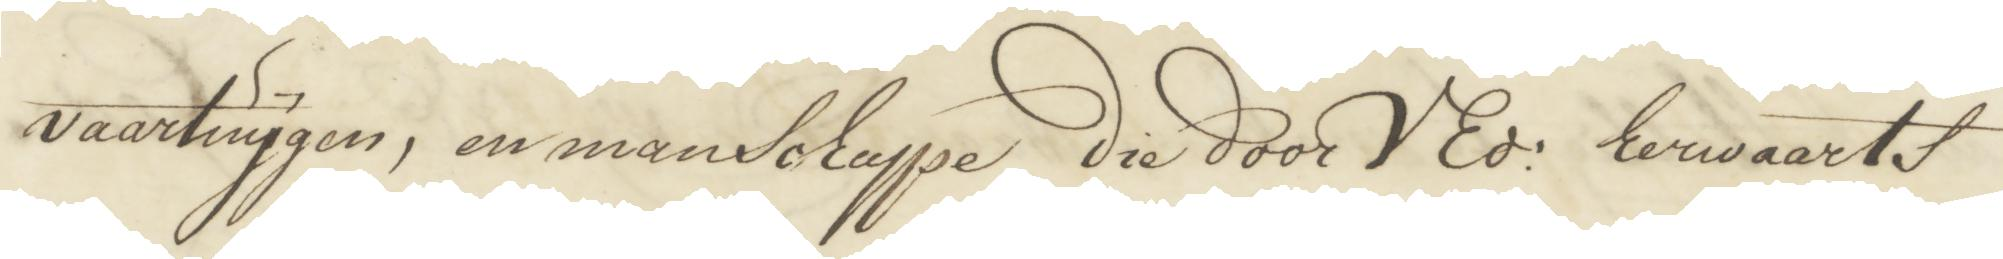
vaertuijgen, en manschappe die door VEd: herwaarts
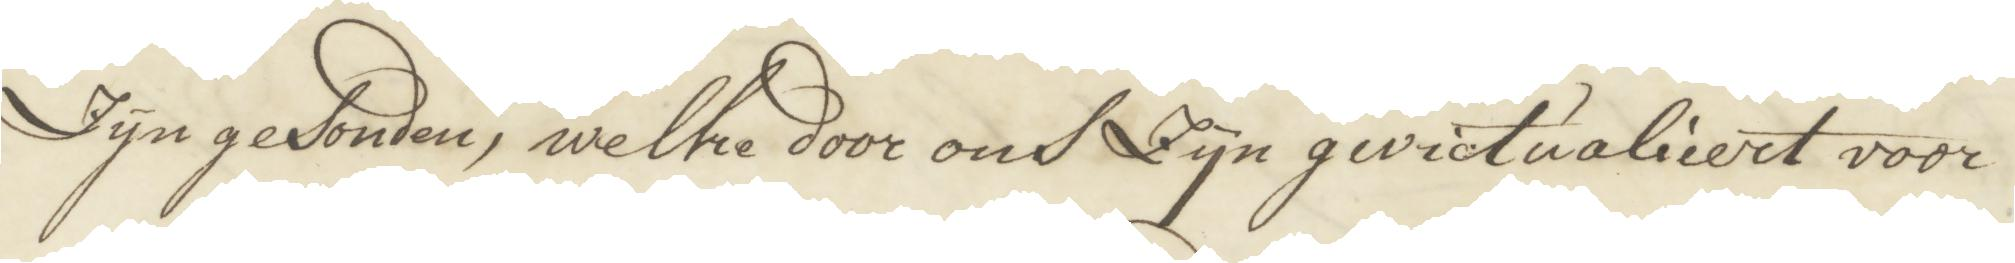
zijn gesonden, welke door ons zijn gevictualieert voor
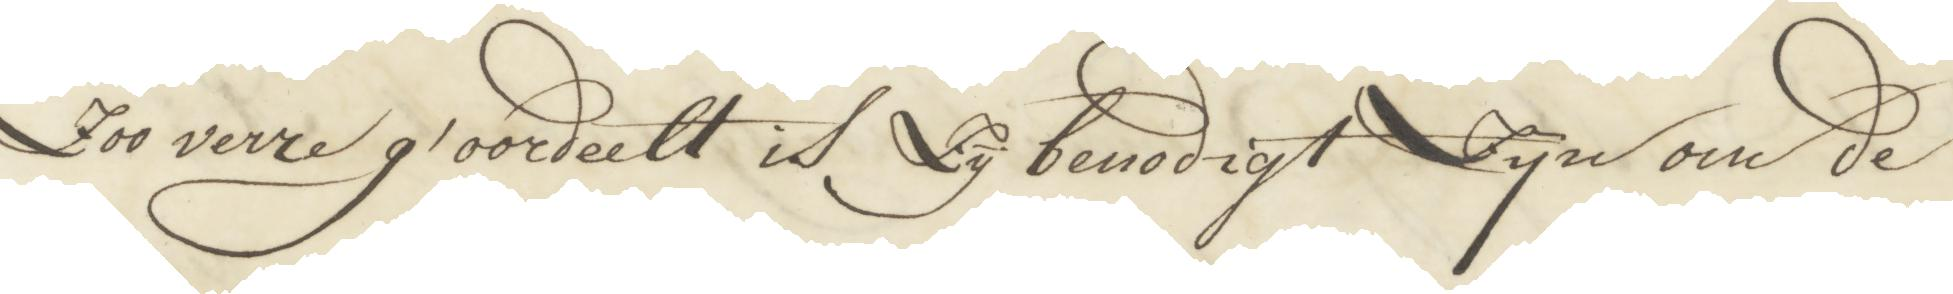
zoo verre g’oordeelt is zij benodigt zijn om de
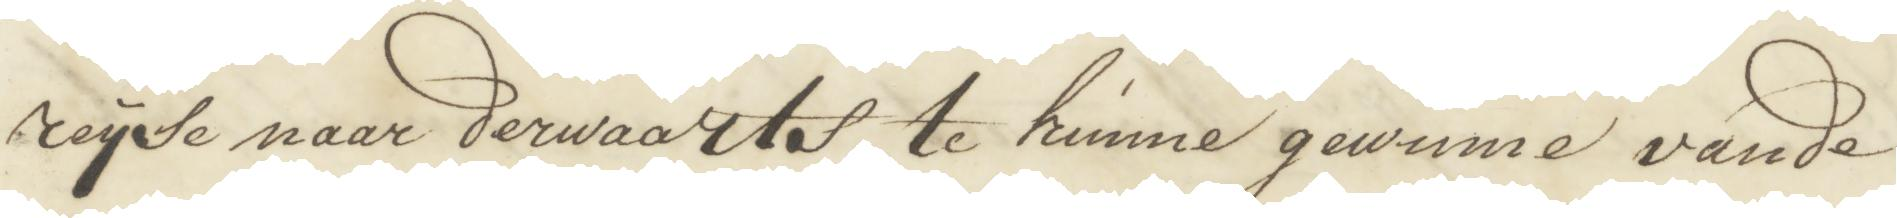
reijse naar derwaarts te kunne gewinne vande
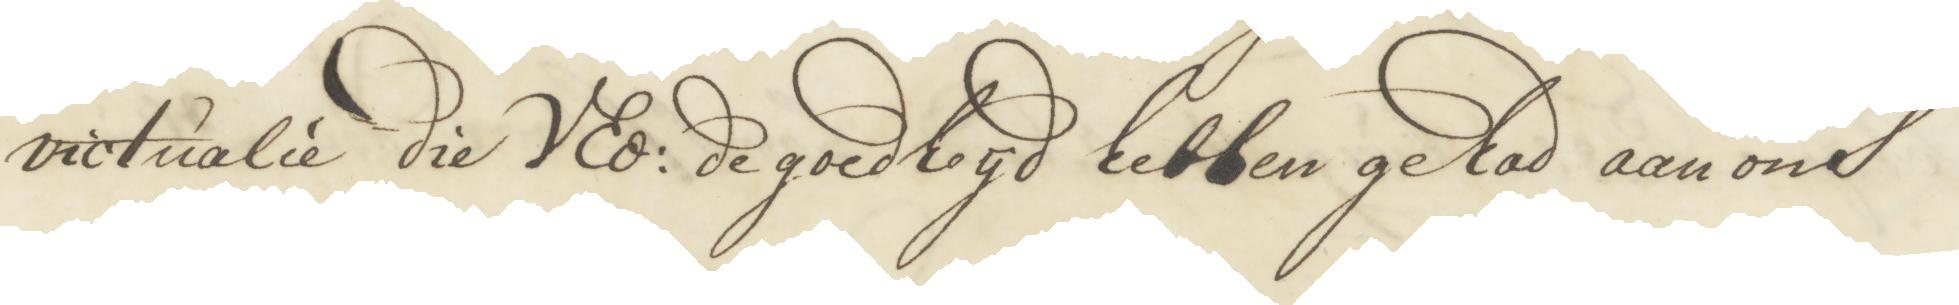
victualie die VEd: de goedheijd hebben gehad aan ons
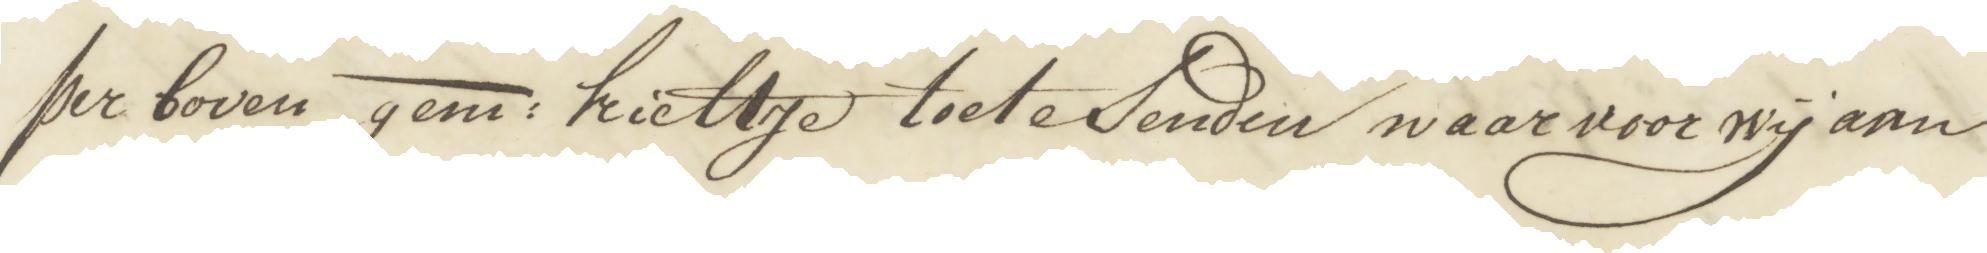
per boven gem: kieltje toete senden waar voor wij aan
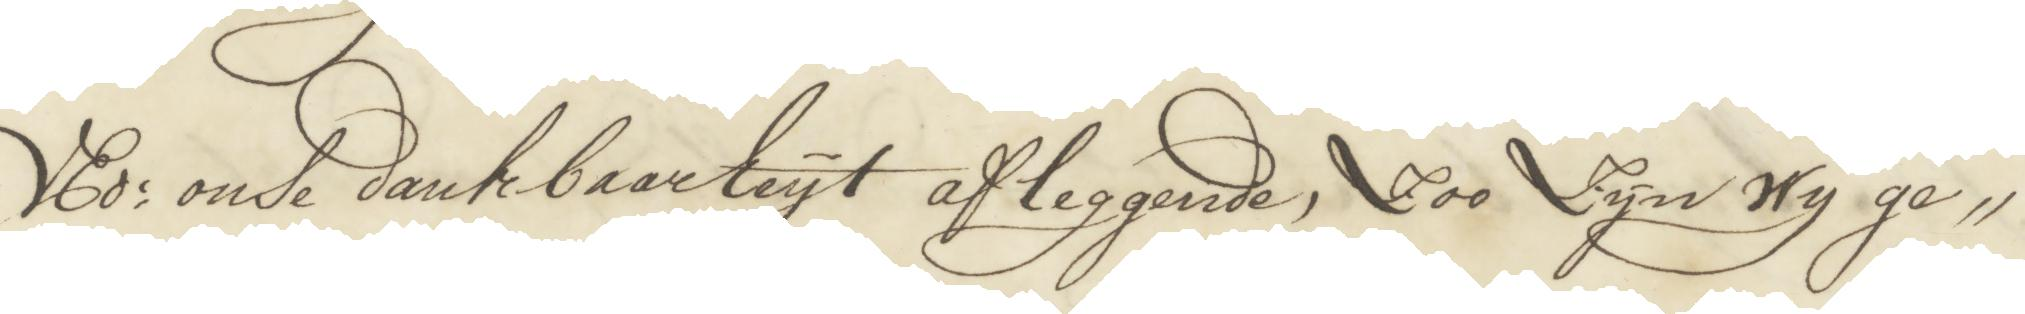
VEd: onse dankbaarheijt afleggende, zoo zijn wij ge„
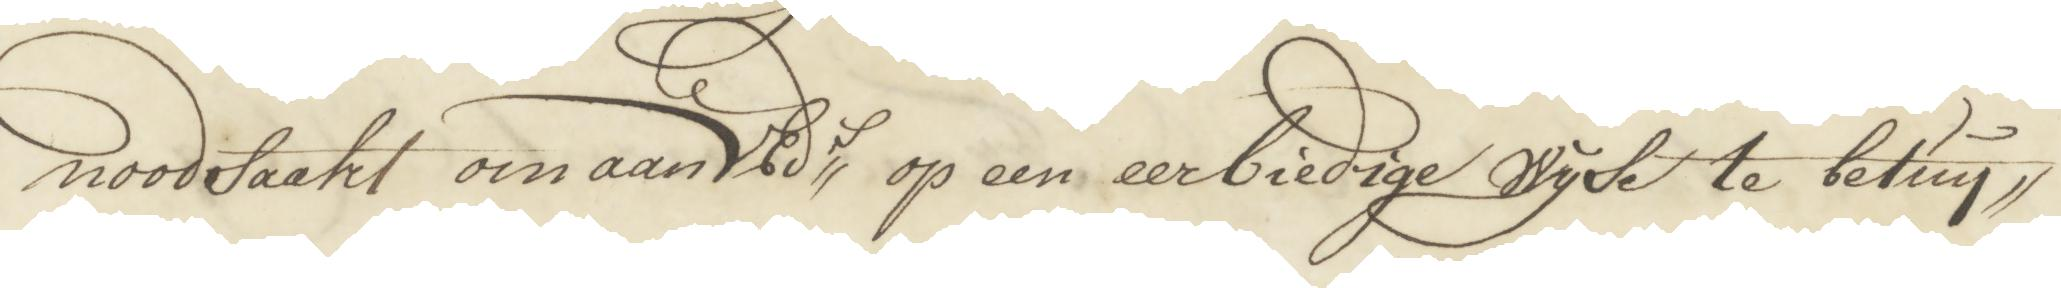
noodsaakt om aan VEd„s op een eerbiedige wijse te betuij„
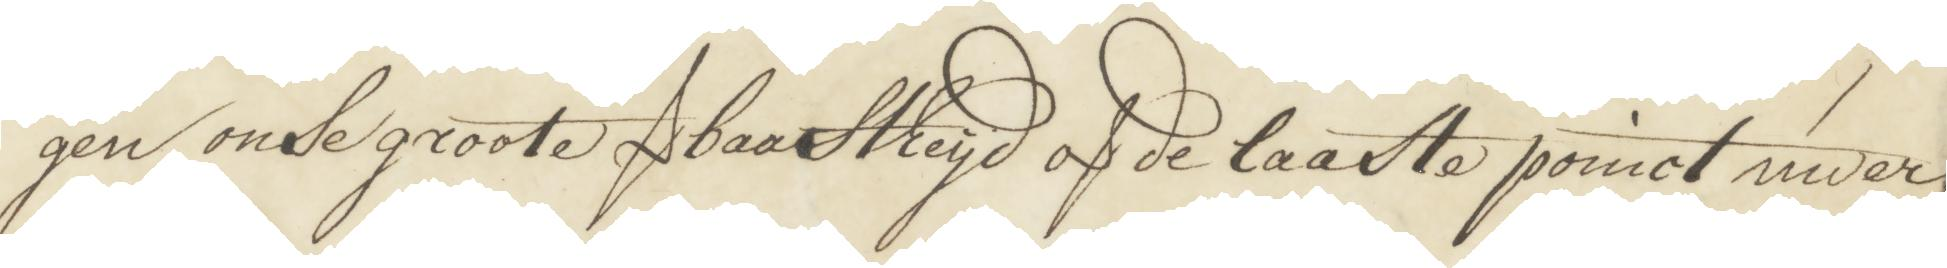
gen onse groote verbaastheijd over de laaste poinct uwer
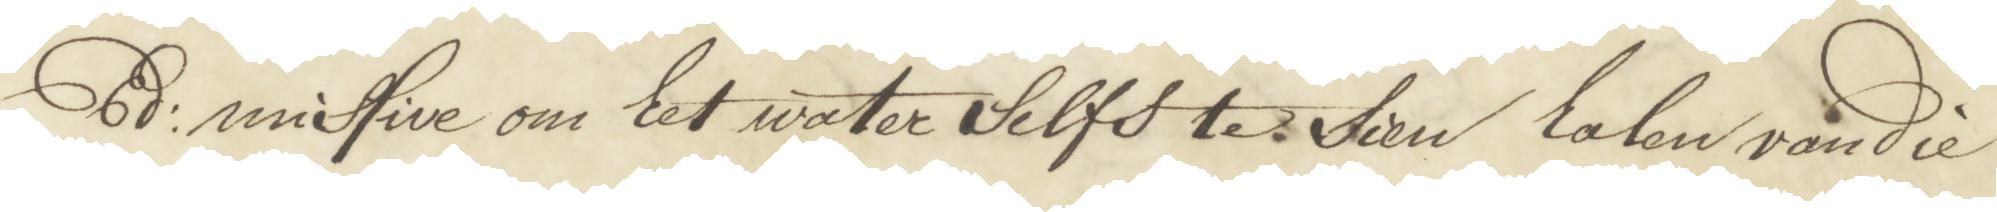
Ed: missive om het water selfs te sien halen van die
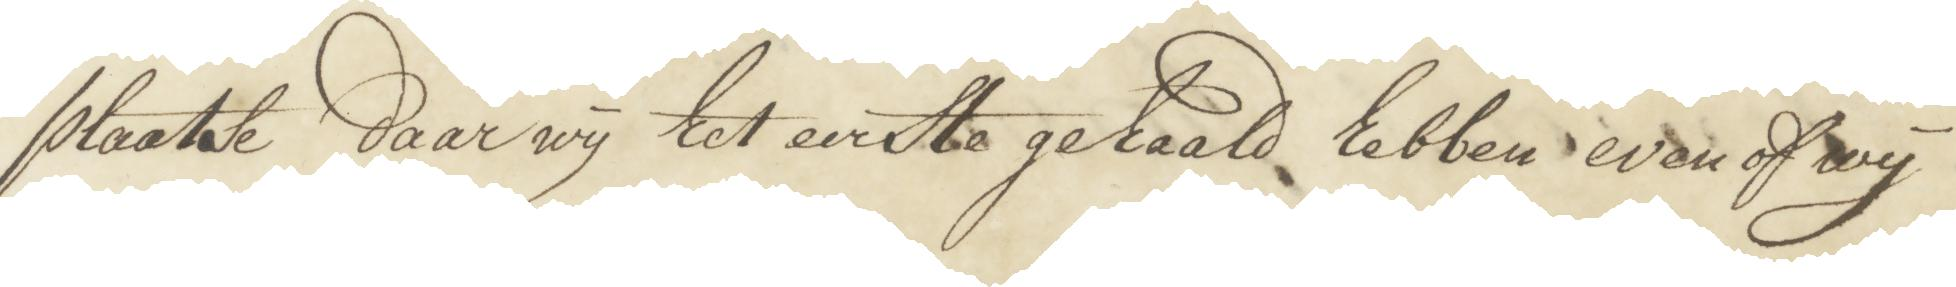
plaatse daar wij het eerste gehaald hebben even of wij
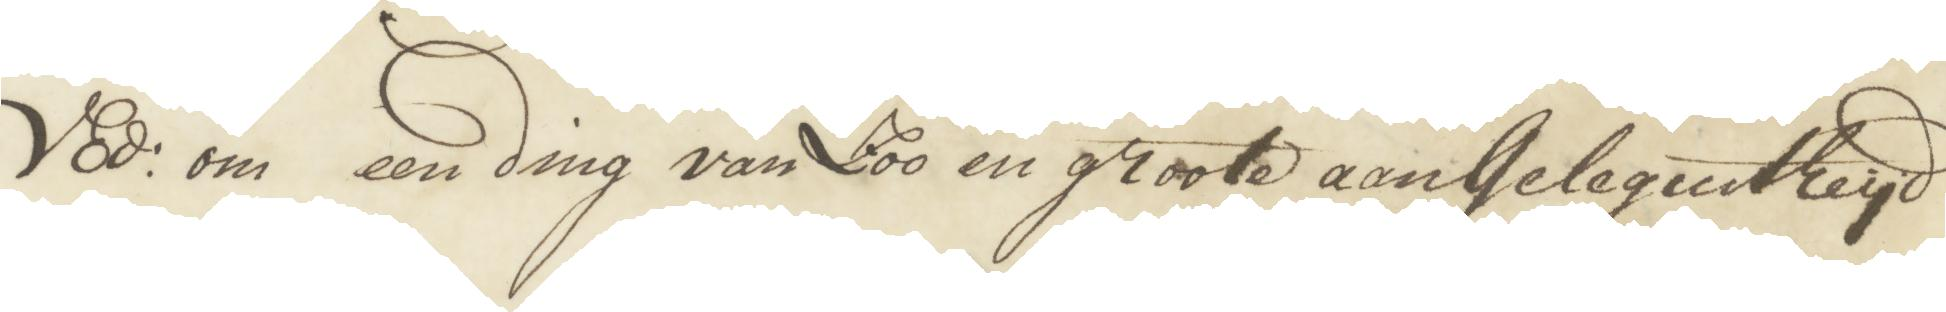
VEd: om een ding van zoo en groote aangelegentheijd
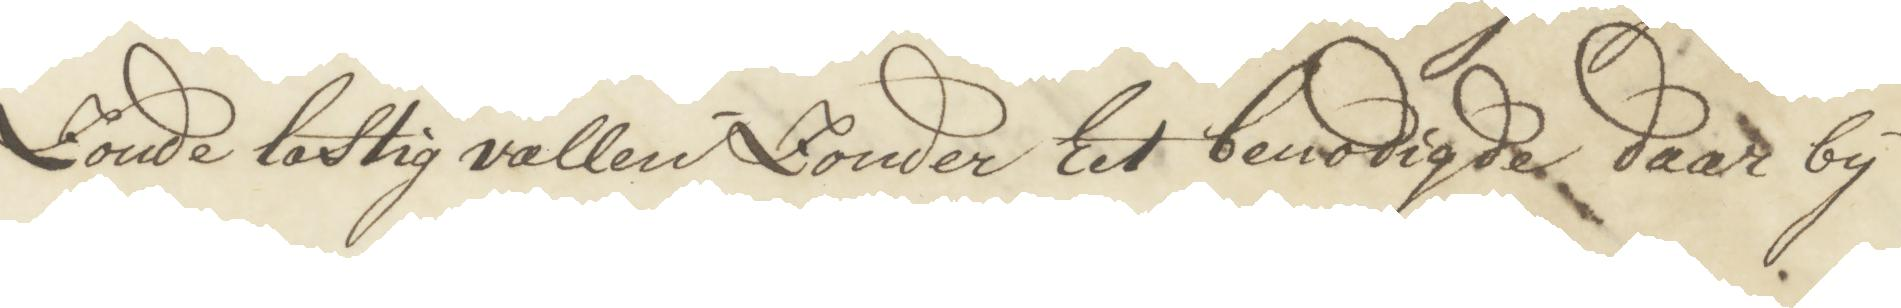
zoude lastig vallen zonder het benodigde daar bij
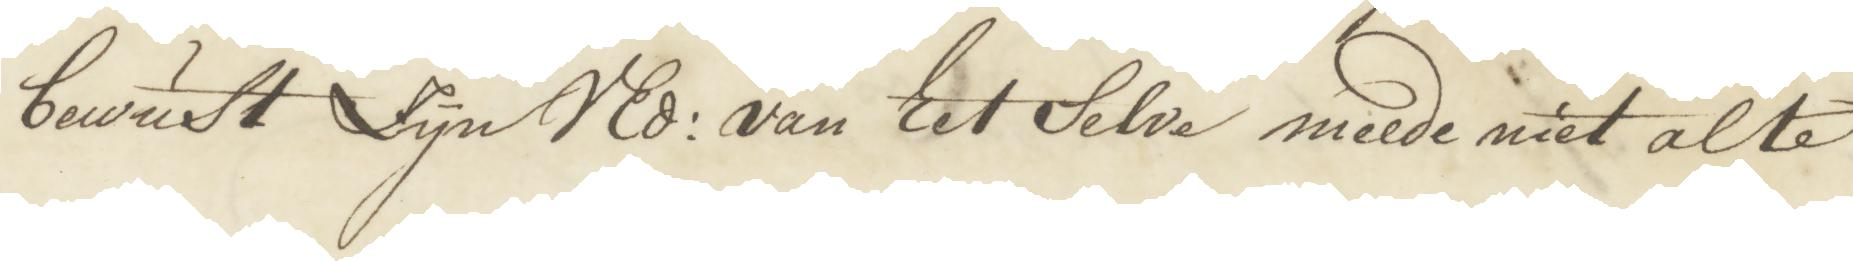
bewust zijn VEd: van het selve meede niet alte
